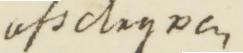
afschryven
